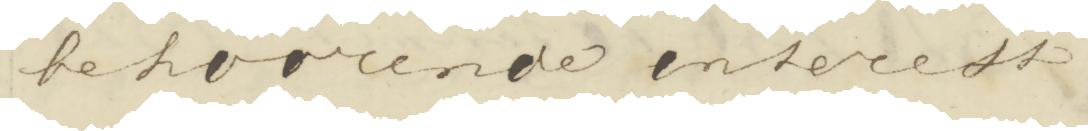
behoorende interest
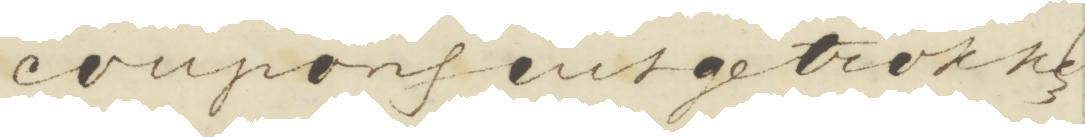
coupons uitgetrokken
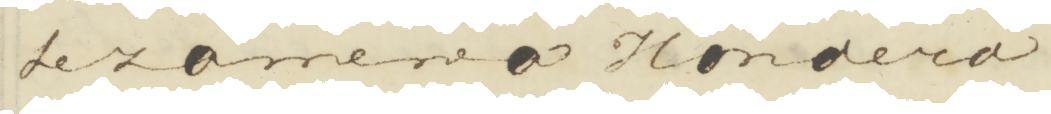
tezamen a Honderd
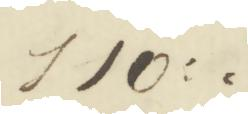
110:
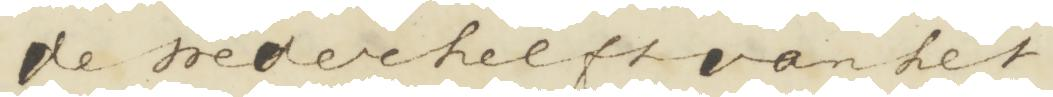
de wederhelft van het
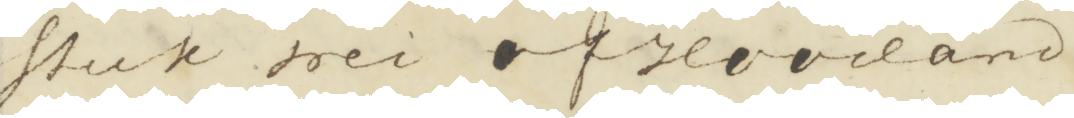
stuk wei of Hooiland
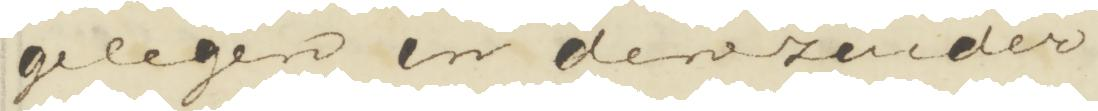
gelegen in den zuider
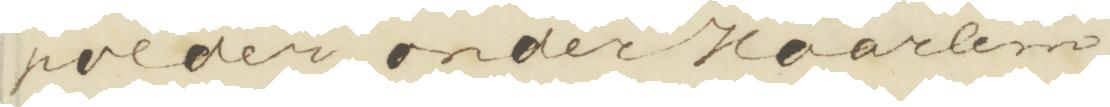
polder onder Haarlem
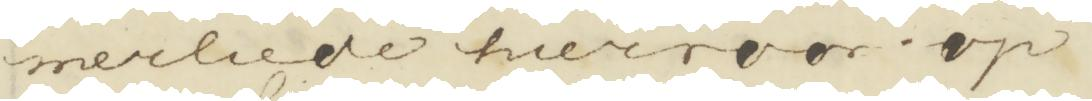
merliede hiervoor op
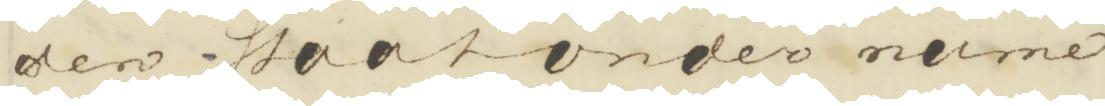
den staat onder nume
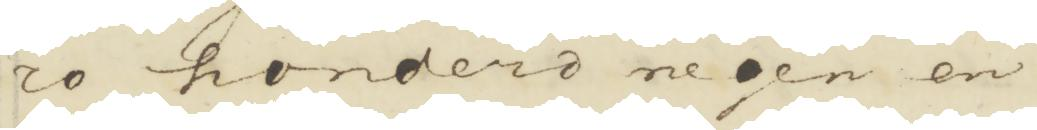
ro honderd negen en
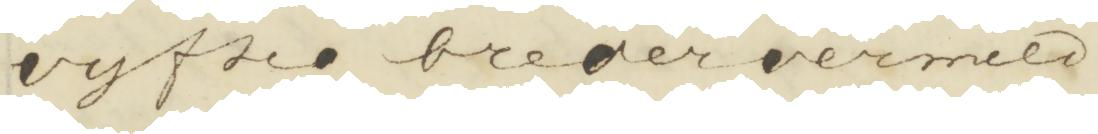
vyftig breder vermeld
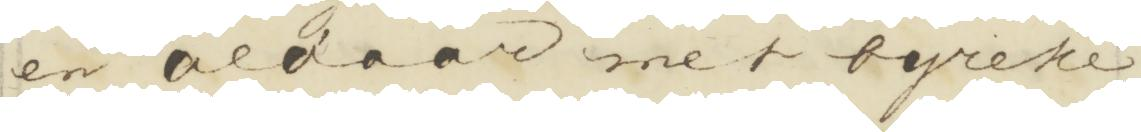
en aldaar met byreke
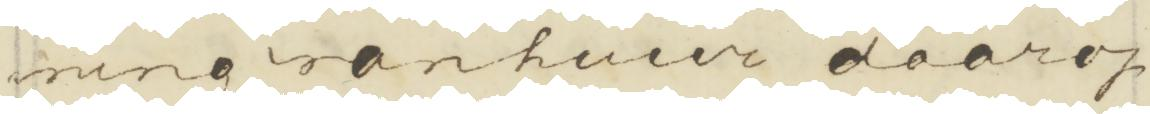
ning van huur daarop
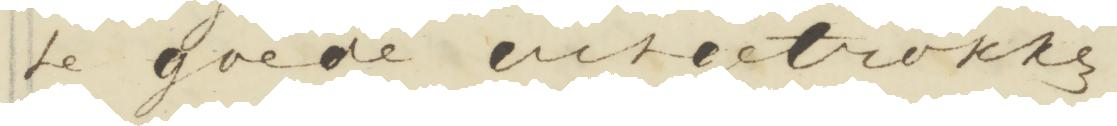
te goede uitgetrokken
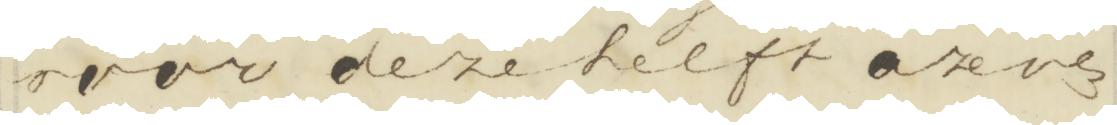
voor deze helft a zeven
